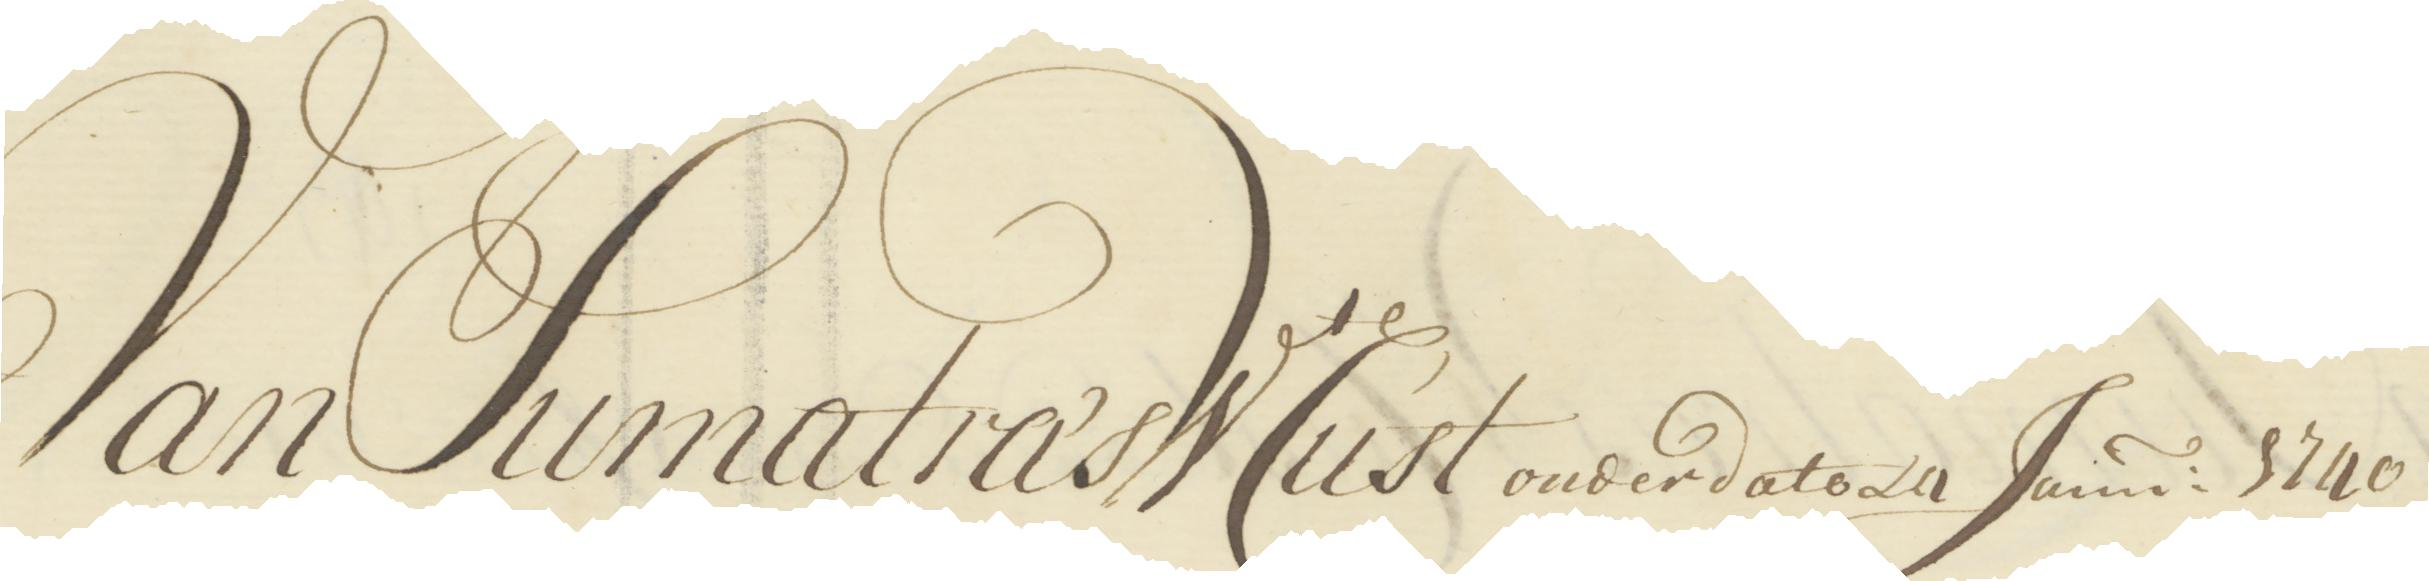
Van Sumatra'sWt Cust onderdato 14 Jann: 1740
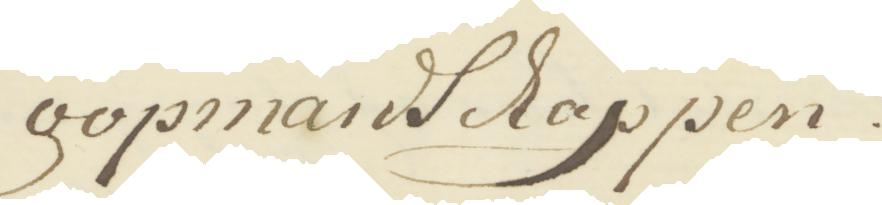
Coopmanschappen.
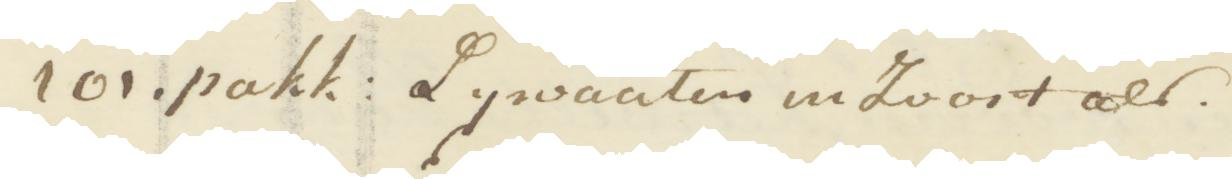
101. pakk: Lijwaaten in Zoort als.
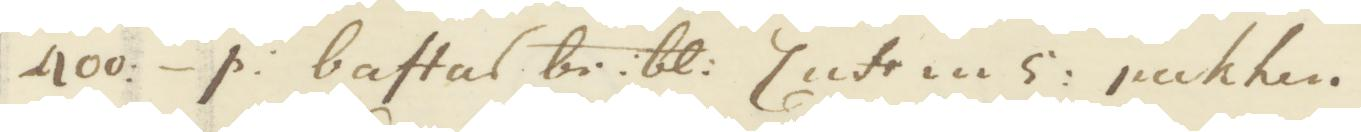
400: – p: baftas br:bl: Cust en 5: pakken
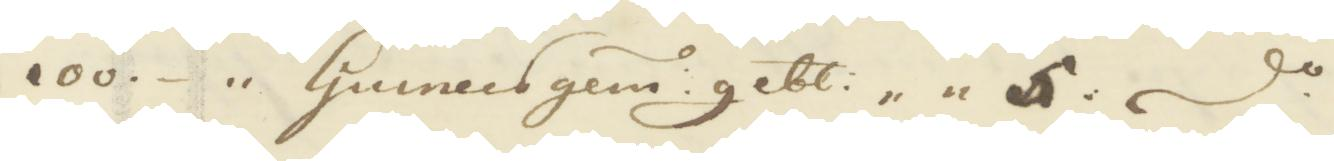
100. – „ Guinees gem: gebl: „ „ 5: _.o
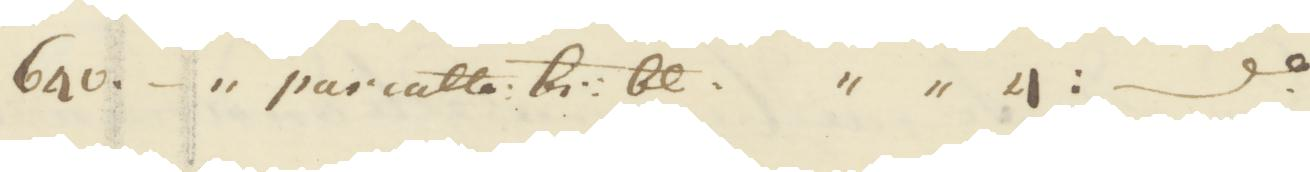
640. – „ parcalle: br: bl . „ „ 4: _.o
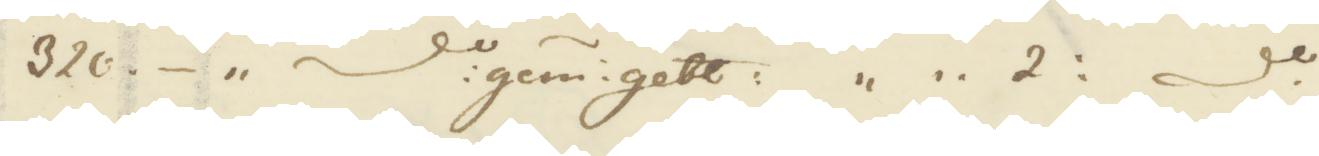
320. – „ _o gem: gebl: „ „ 2: _.o
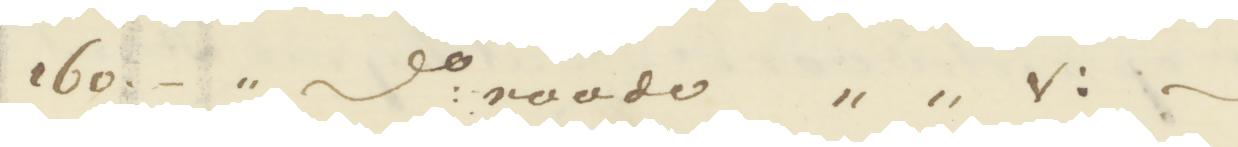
160. – „ d:o roode „ „ v: _o
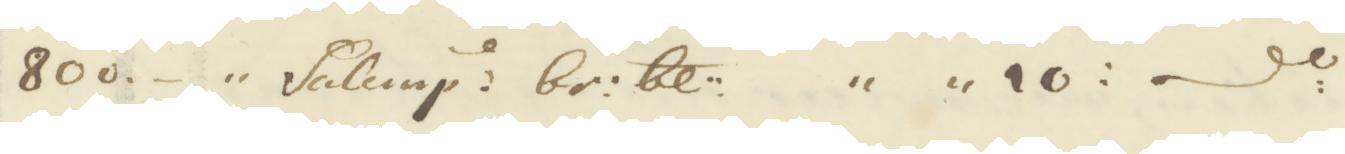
800. – „ Salemp:e br: bl.: „ „ 10: _:o
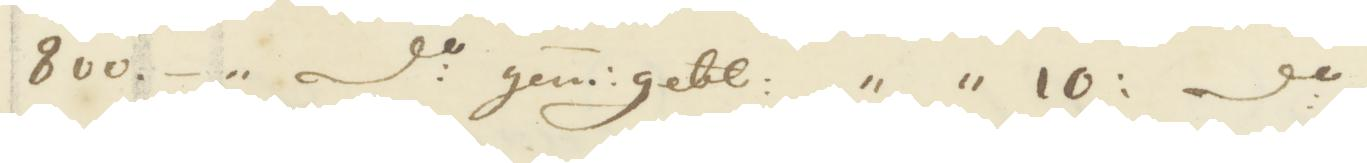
800. – „ _:o gem: gebl: „ „ 10: _:o
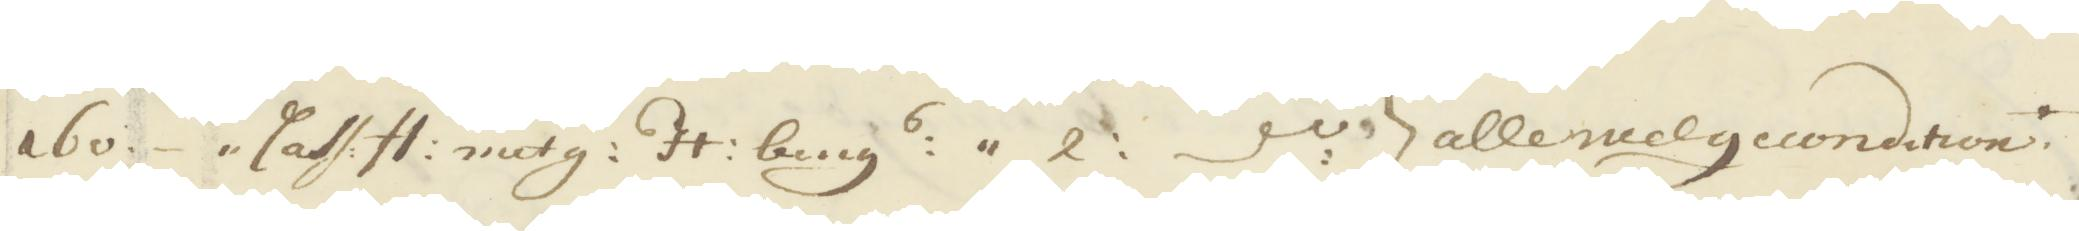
160. – „ Cass: fl: met g: H: beng:s „ 2: _:o: alle welgecondition,t
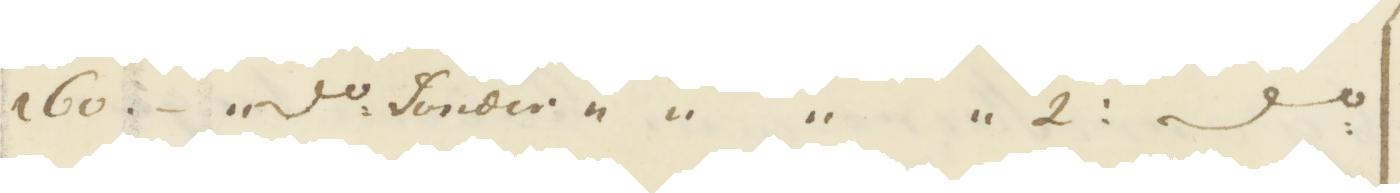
160. – „ _:o: sonder „ „ „ „ 2: _:o
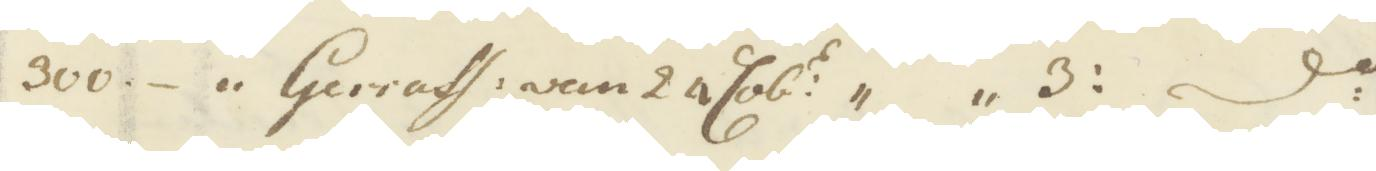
300. – „o Gerrass: van 24 Cob:s „ 3: _:o
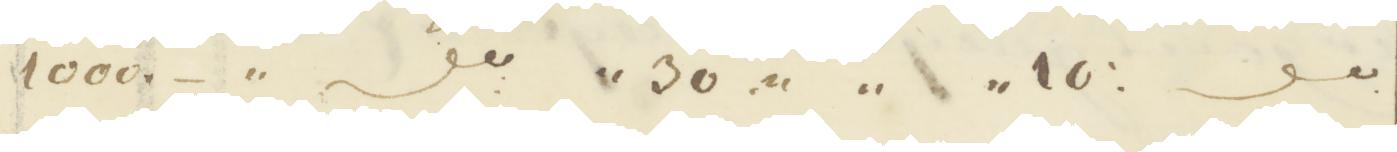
1000. – „ _:o „30 „ „ „ 10: _.o
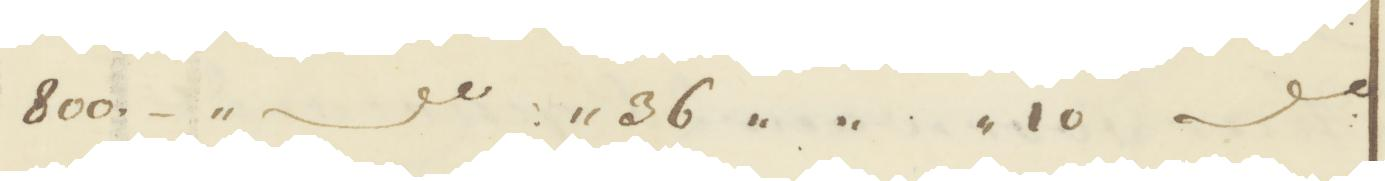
800. – „ _o : „ 36 „ „ „10. _:o
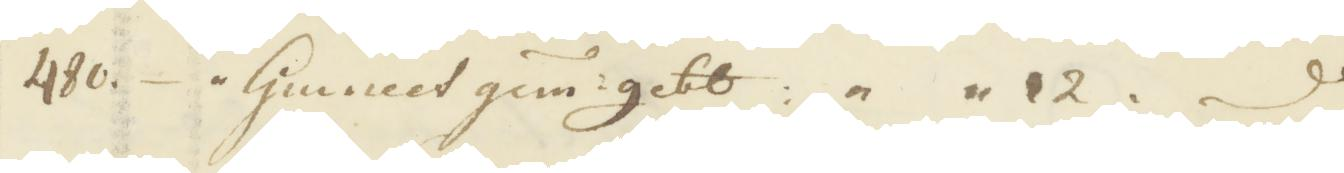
480. – „ Guinees gem: gebl: „ „ 12. _:o
